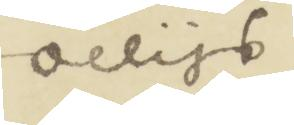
Collijs
